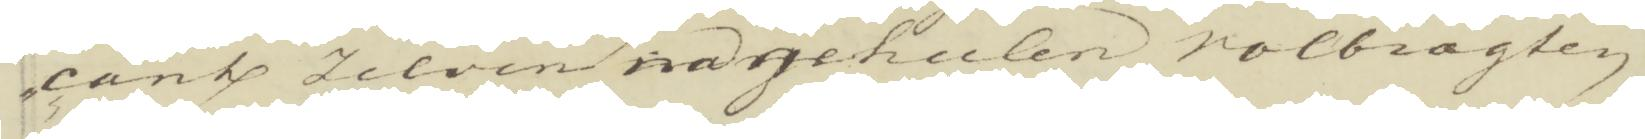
„çant zelven na geheelen volbragten
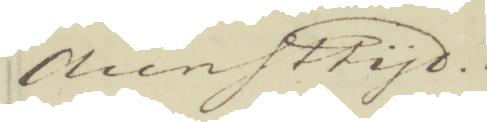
diensttijd.
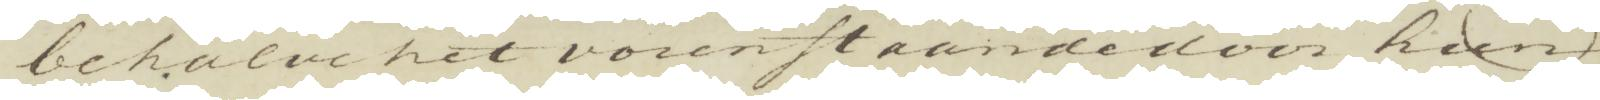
behalve het vorenstaande door hun
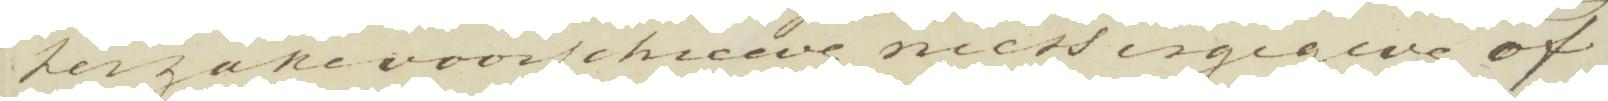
ter zake voorschreeven niets ingegeven of
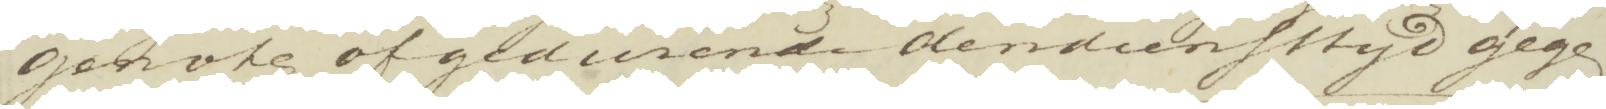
genoten of gedurende den diensttijd gege
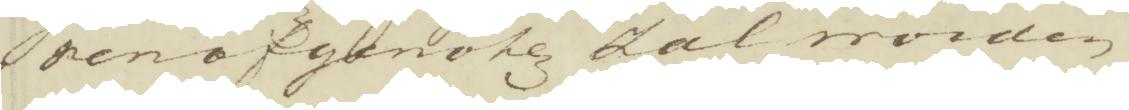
ven of genoten zal worden
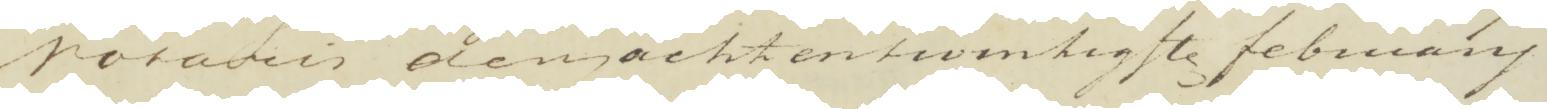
Notaris den acht entwintigsten february
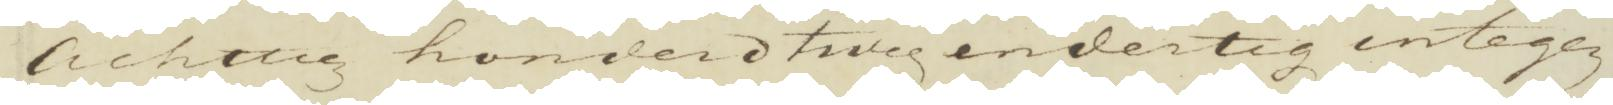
achttien honderd twee en dertig in tegen
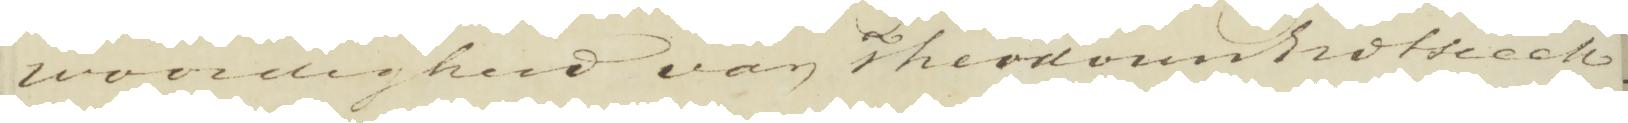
woordigheid van Theodorus Erdtsieck
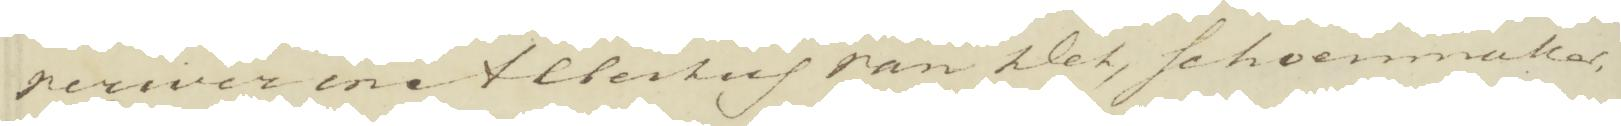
verwer in Albertus van Det, schoenmaker,
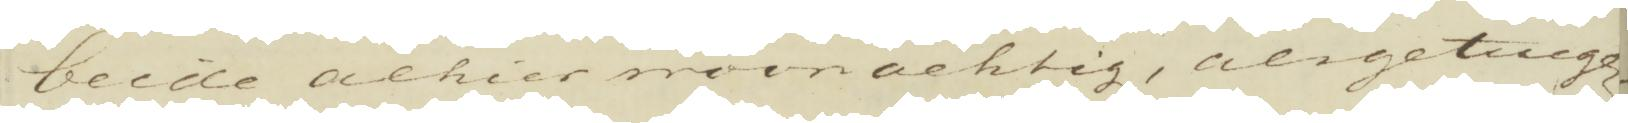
beide alhier woonachtig, als getuigen
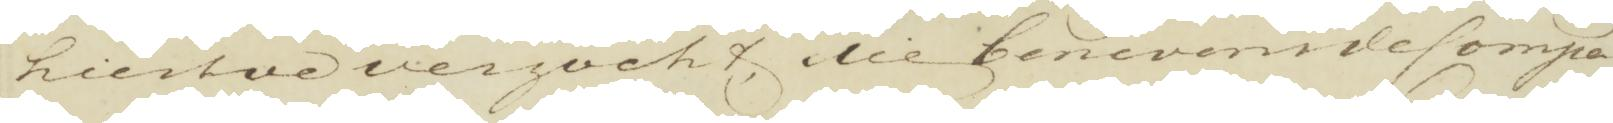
hiertoe verzocht, die benevens de Compa
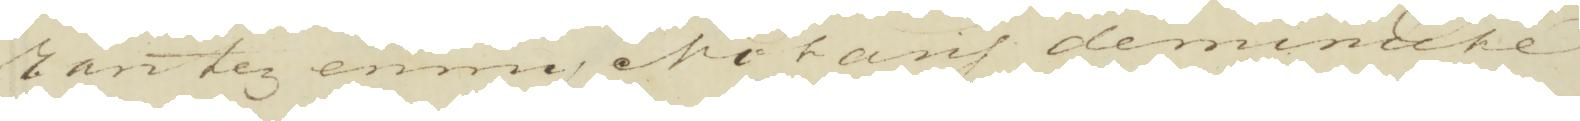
ranten en my Notaris de minute
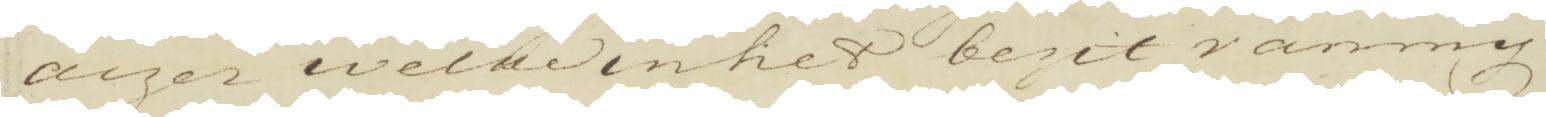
dezer welke in het bezit van my
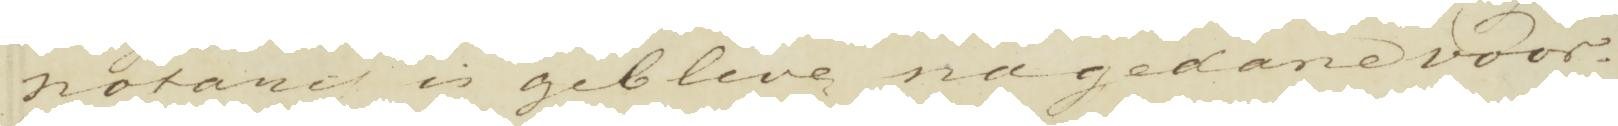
notaris is gebleven na gedane voor
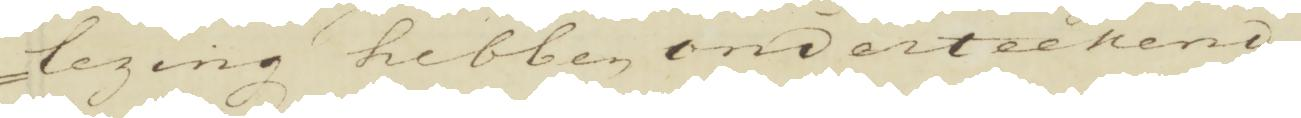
=lezing hebben onderteekend
